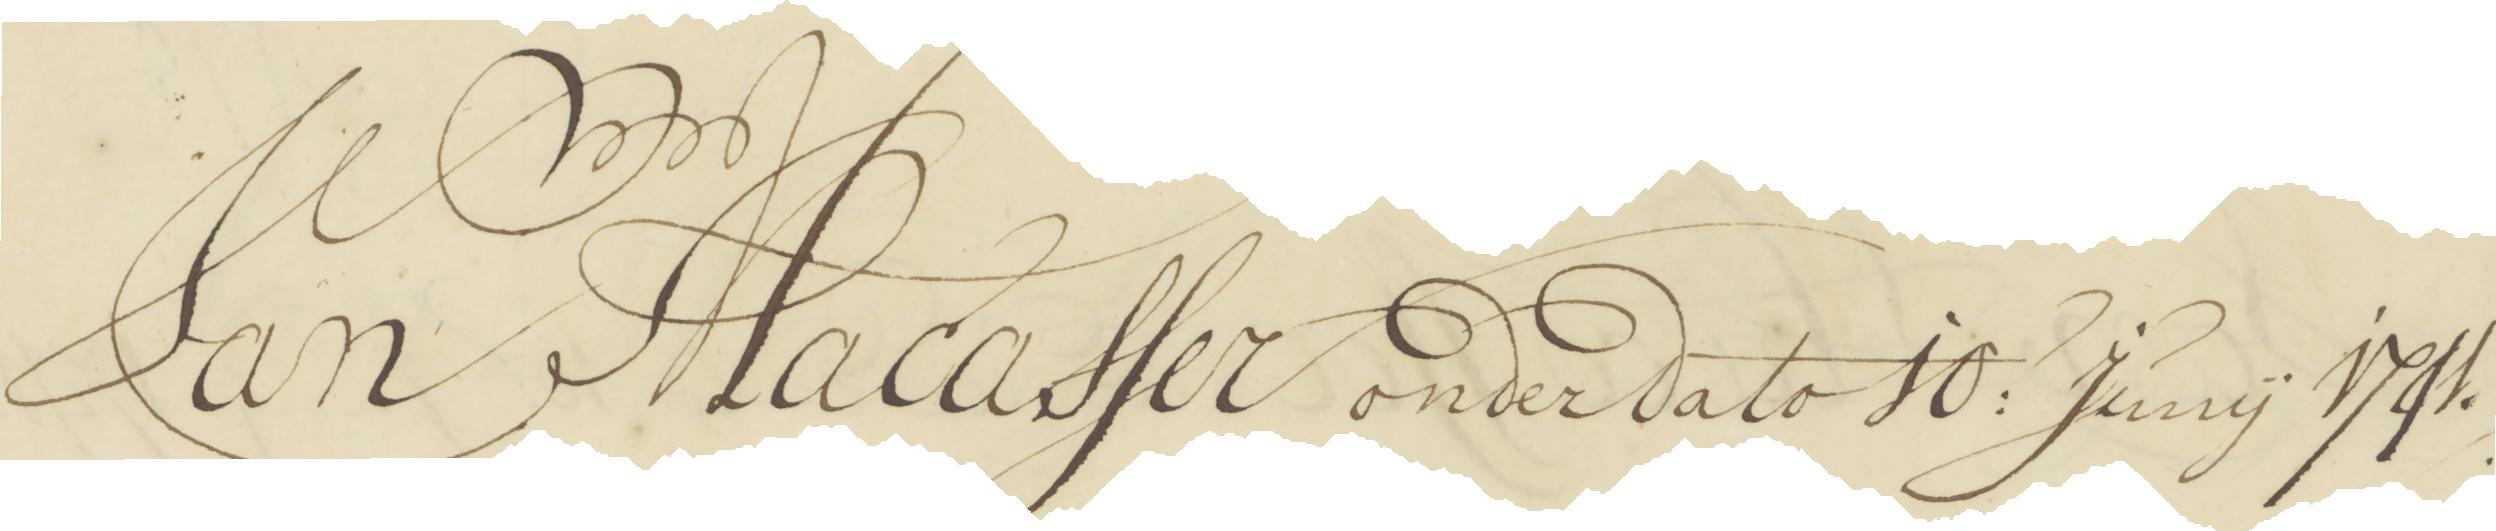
Van Macasser onder dato 10:' Junij 1741.
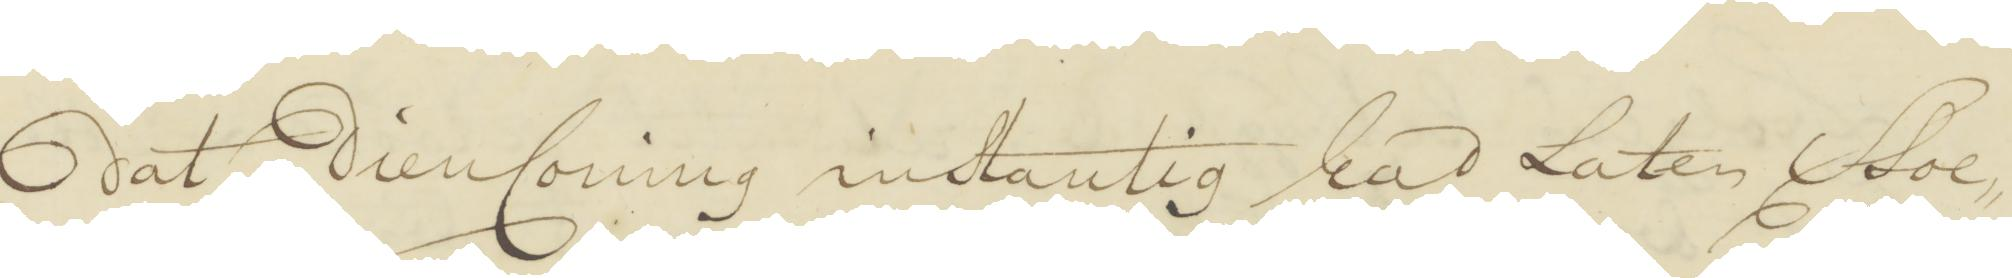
dat dien Coning instantig had laten versoe„
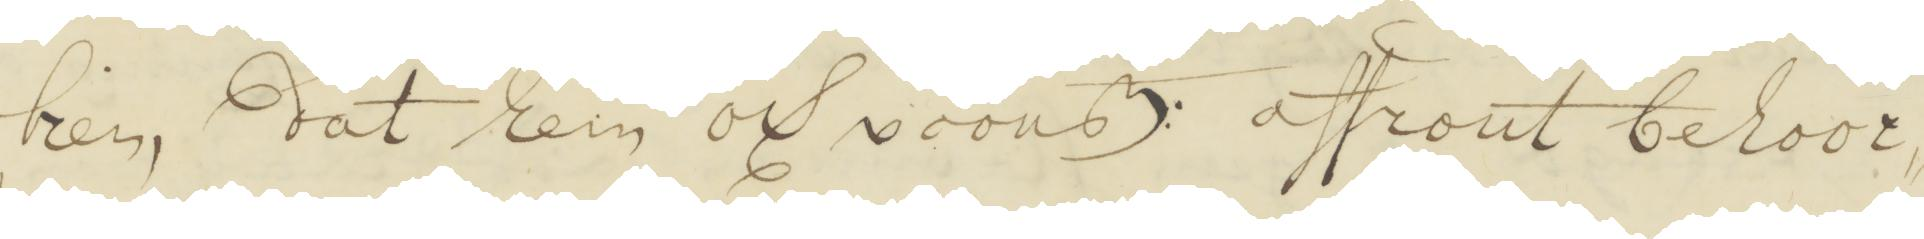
ken, dat hem over voorsz: affront behoor„
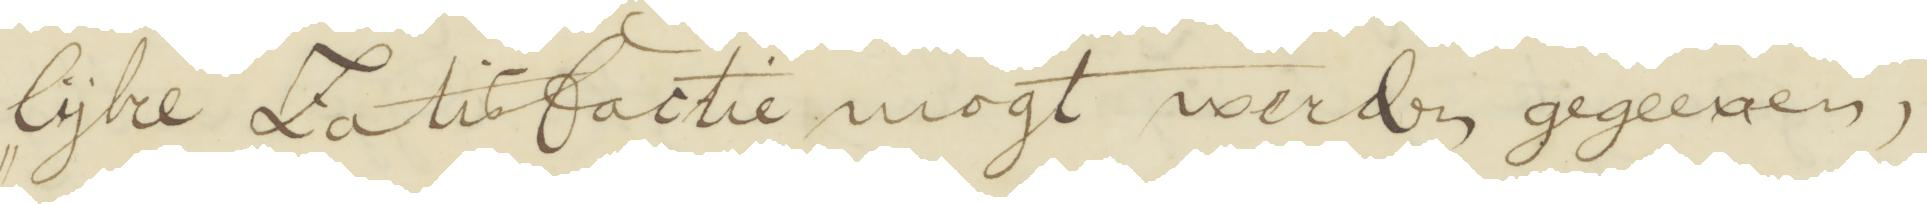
„lijke zatisfactie mogt werden gegeeven,
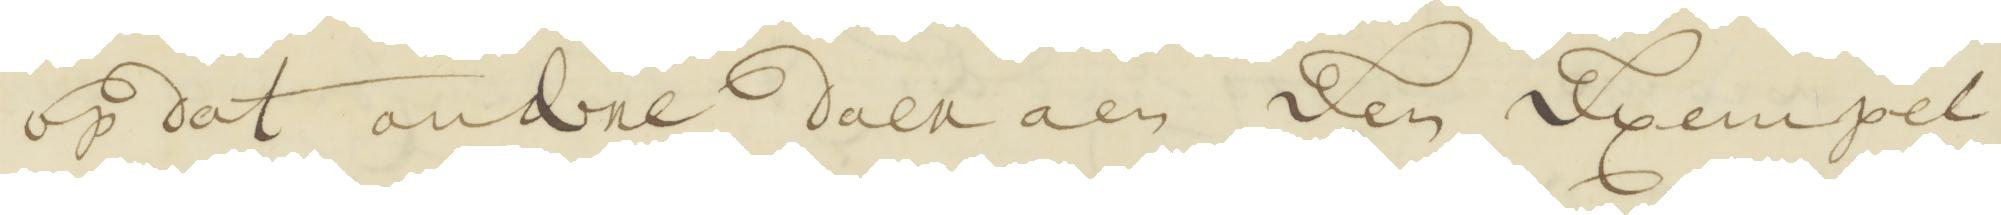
op dat andere daer aen Een Exempel
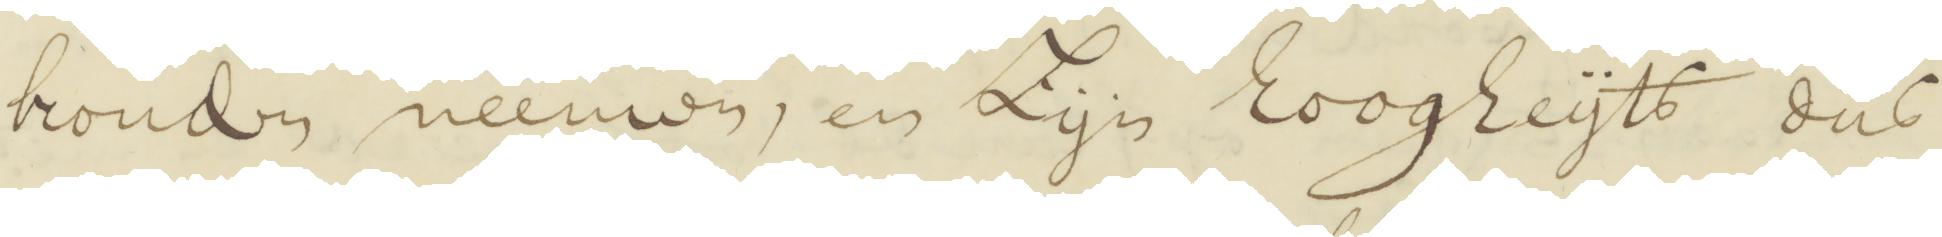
konden neemen, en zijn hoogheijts dus
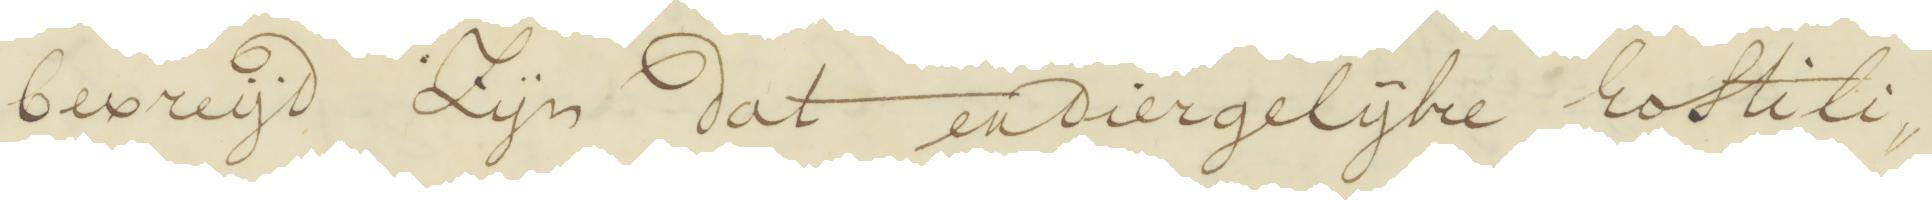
bevreijd zijn dat er diergelijke hostili„
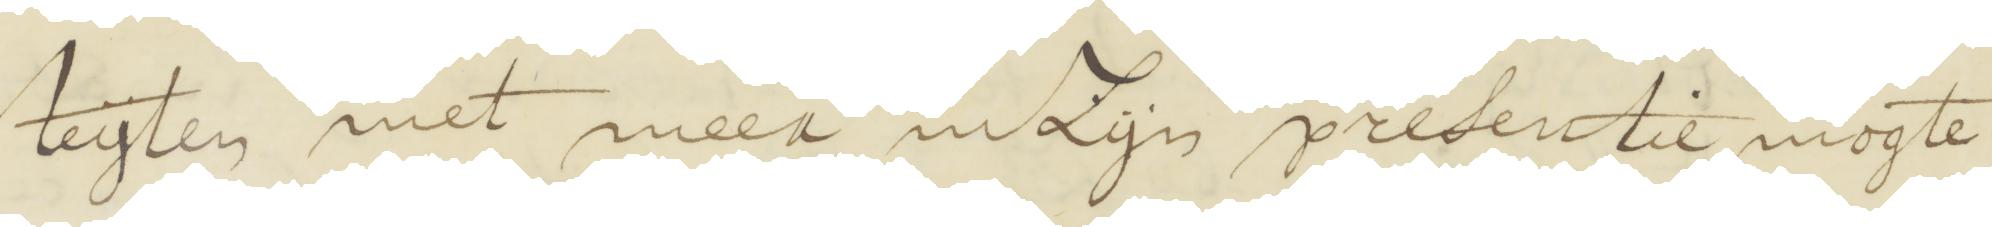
teijten niet meer in zijn presentie mogte
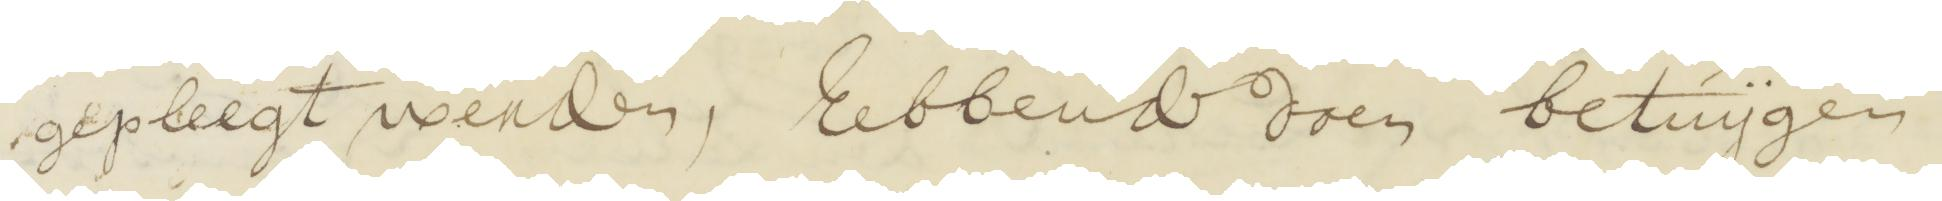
gepleegt werden, hebbende doen betuijgen
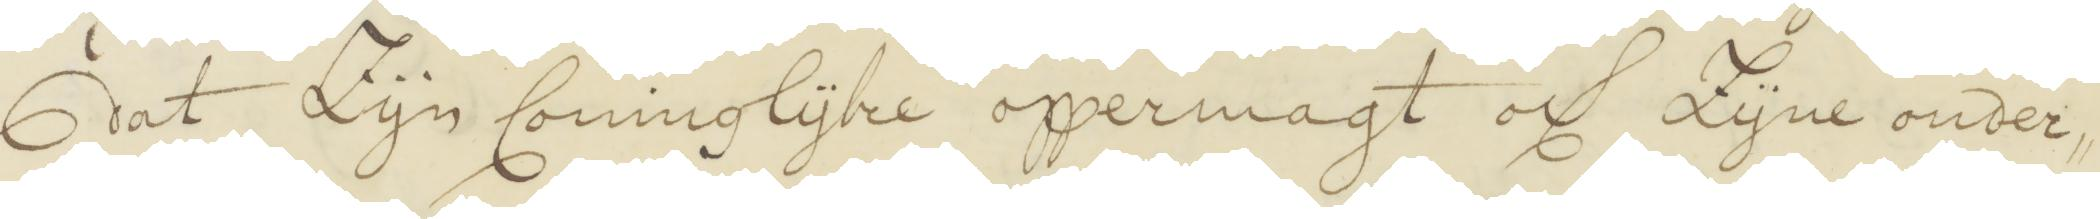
dat zijn Coninglijke oppermagt over zijne onder„
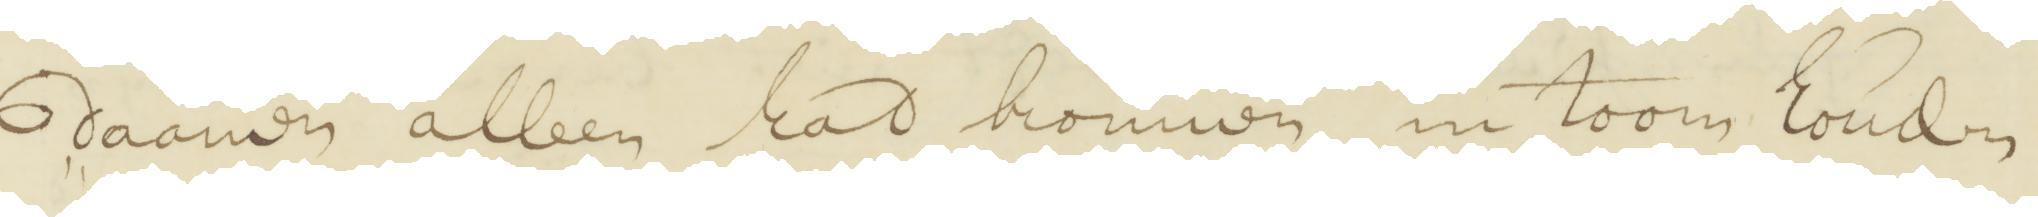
„daanen alleen had konnen in toom houden
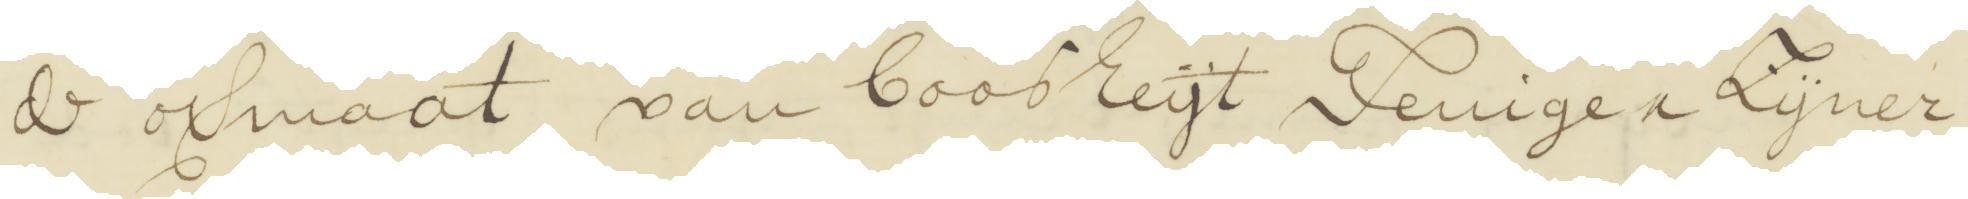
de overmaat van boosheijt Eeniger zijner
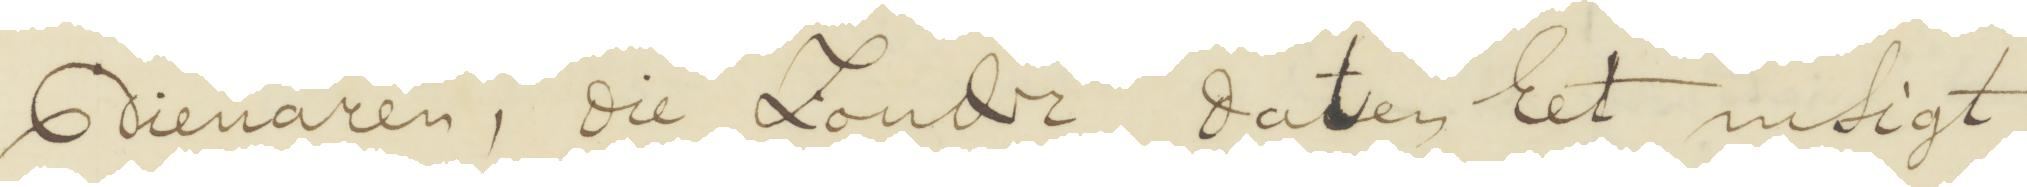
dienaren, die zonder dat en het insigt
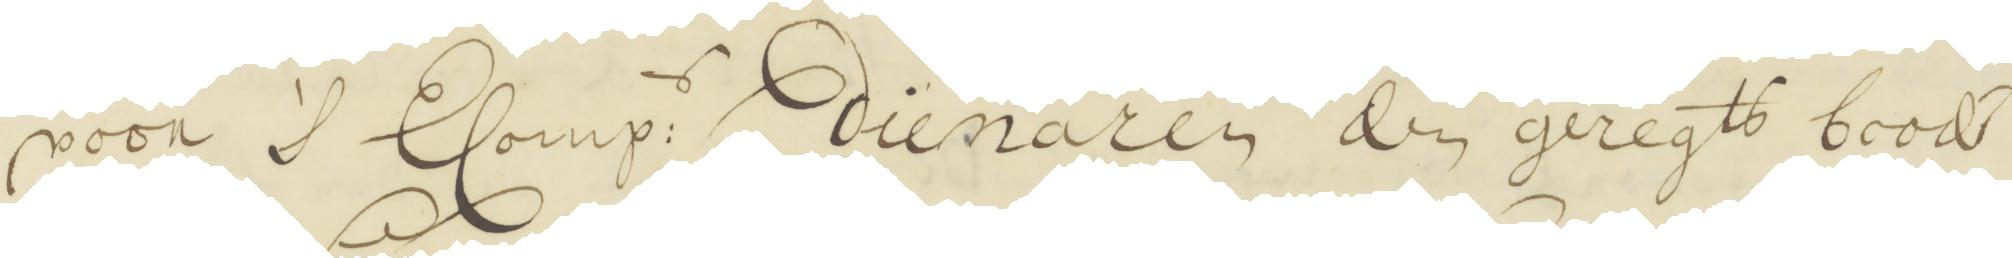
voor ’s EComp:s dienaren den geregts boode
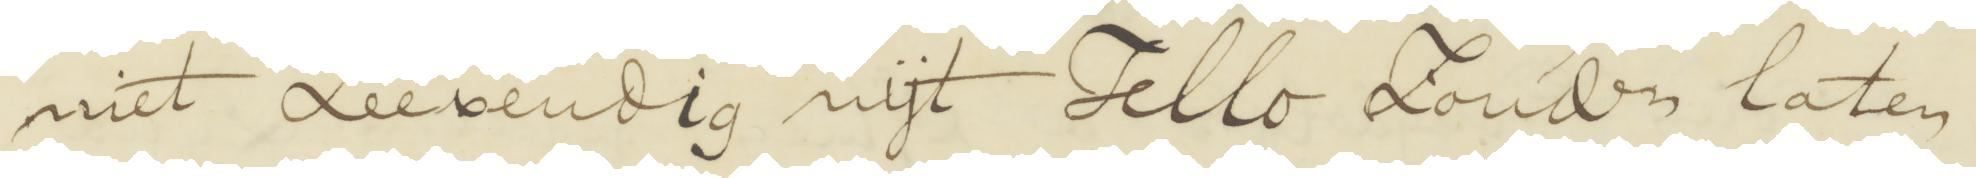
niet Leevendig uijt Tello Zouden laten
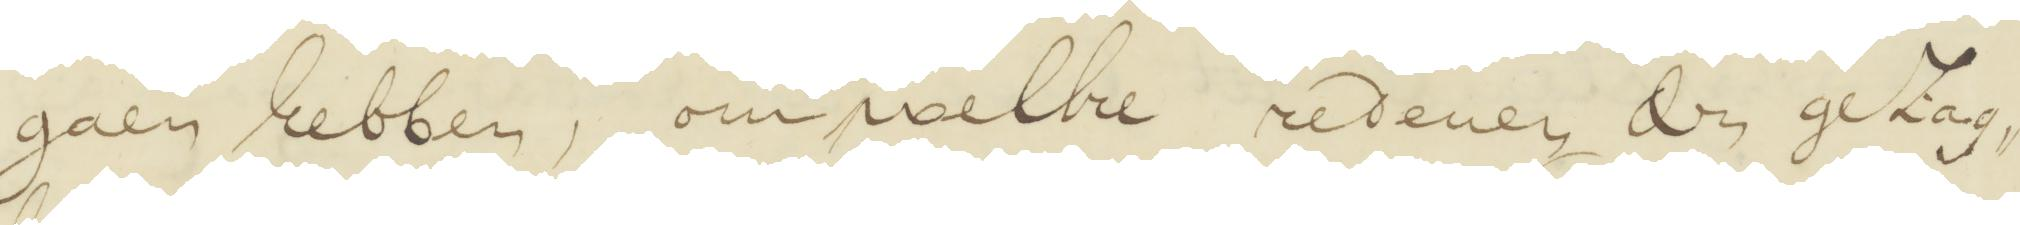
gaen hebben, om welke redenen den gezag„
